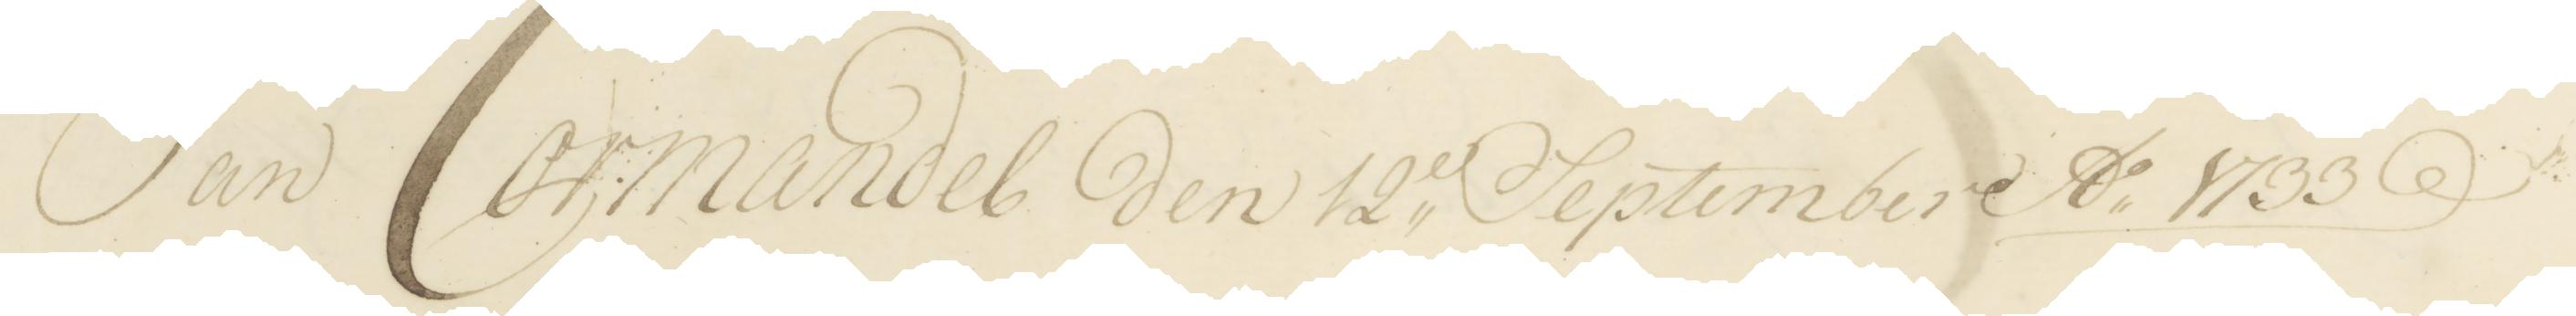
Van Cormandel den 12„e September A„o 1733 @
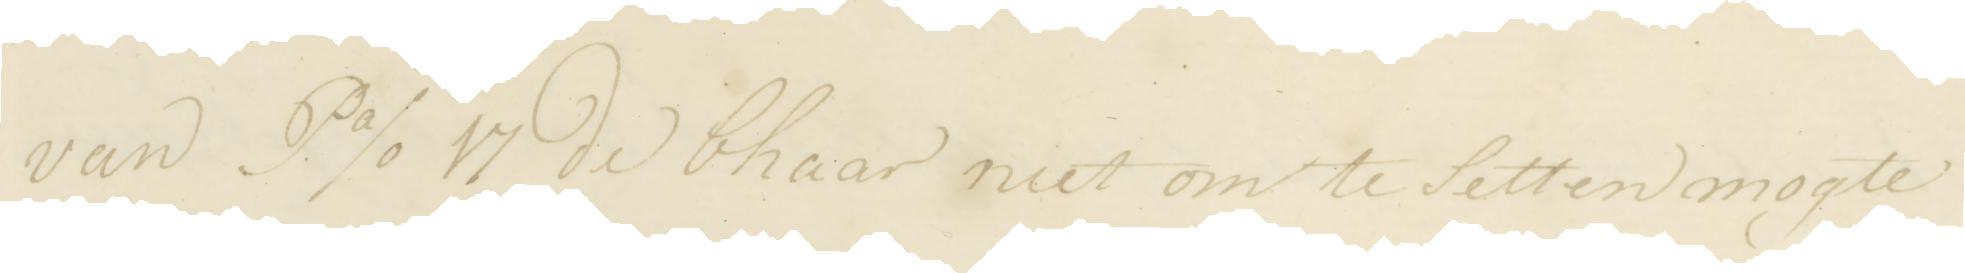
van P.a/o 17 de bhaar niet om te setten mogte
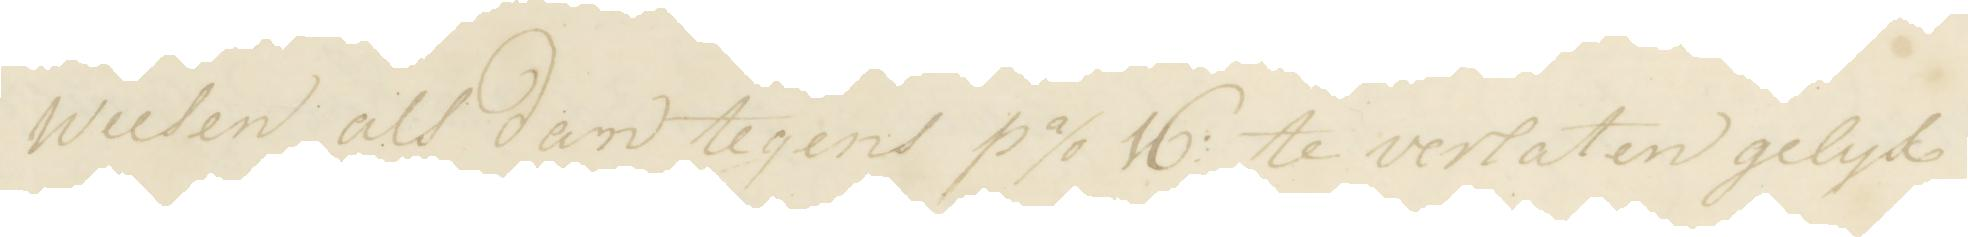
weesen als dan tegens p a/o 16: te verlaten gelyk
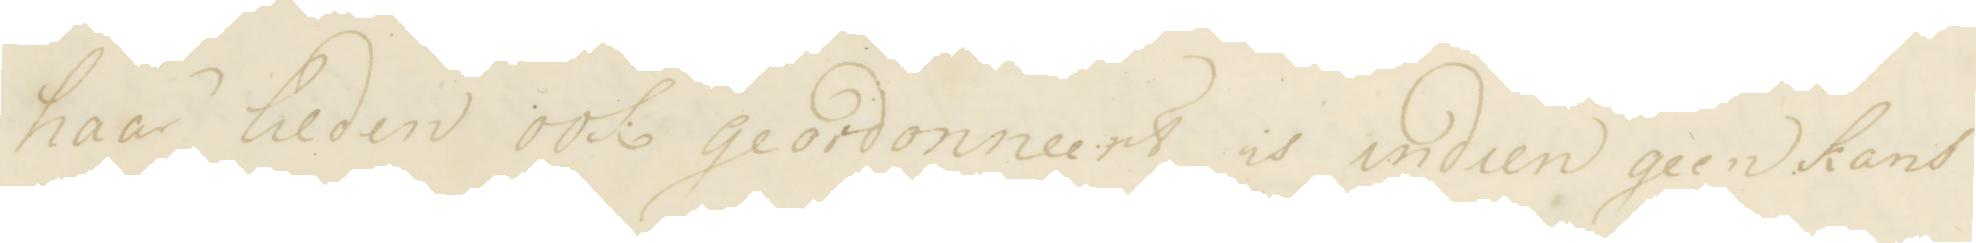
haar lieden ook geordonneert is indien geen kans
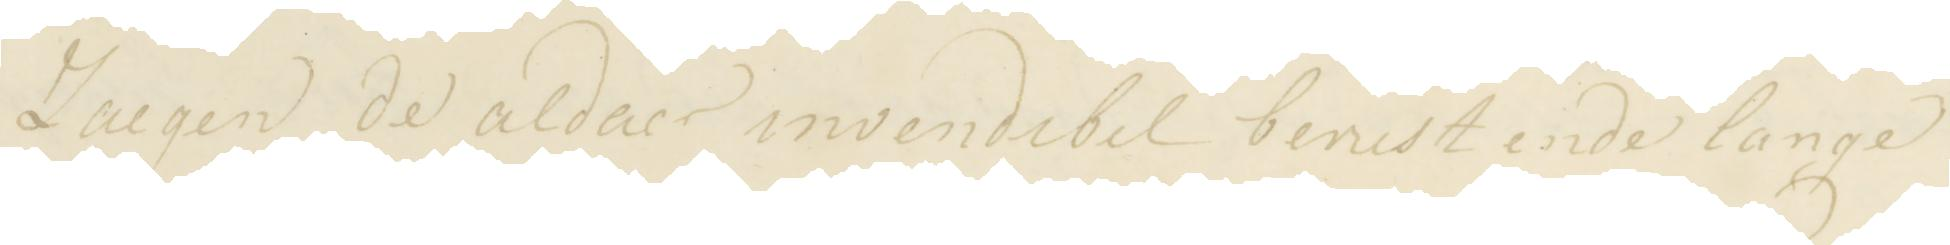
zaegen de aldaer invendibel berustende lange
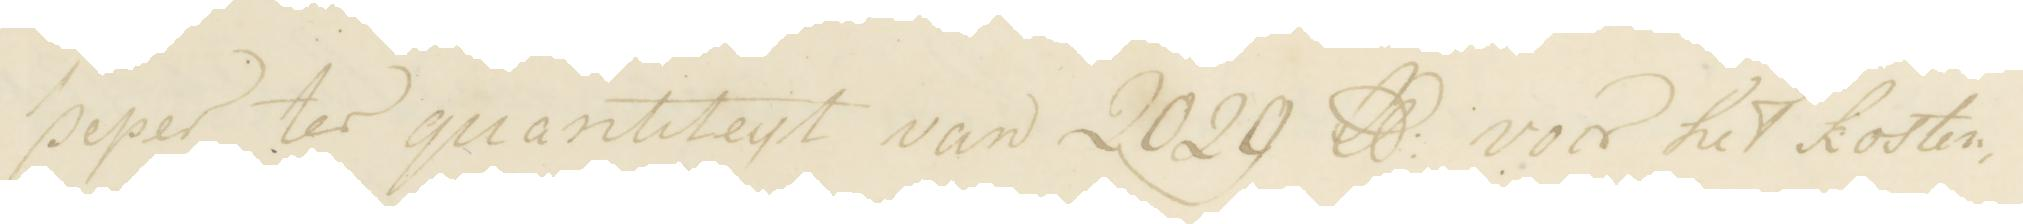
peper ter quantiteijt van 2029 lb: voor het kosten„
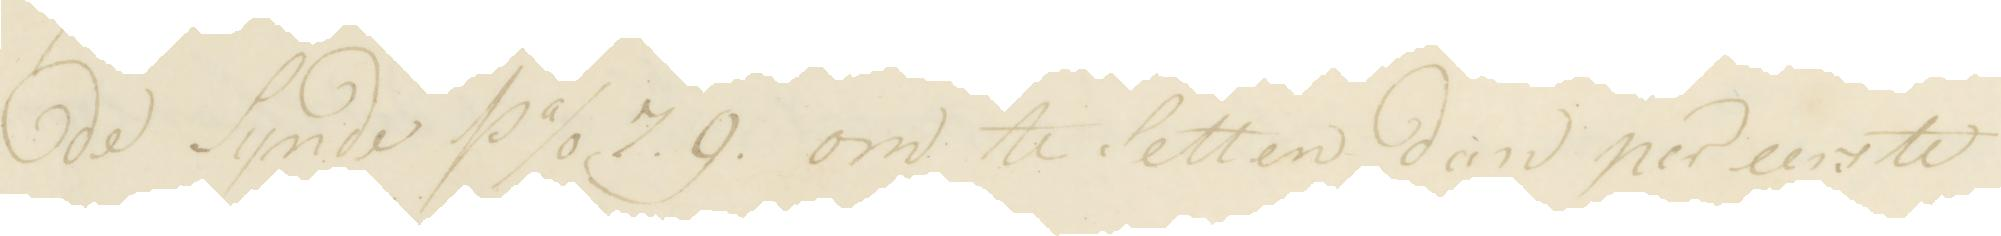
de synde p a/o 7.9. om te setten dan per eerste
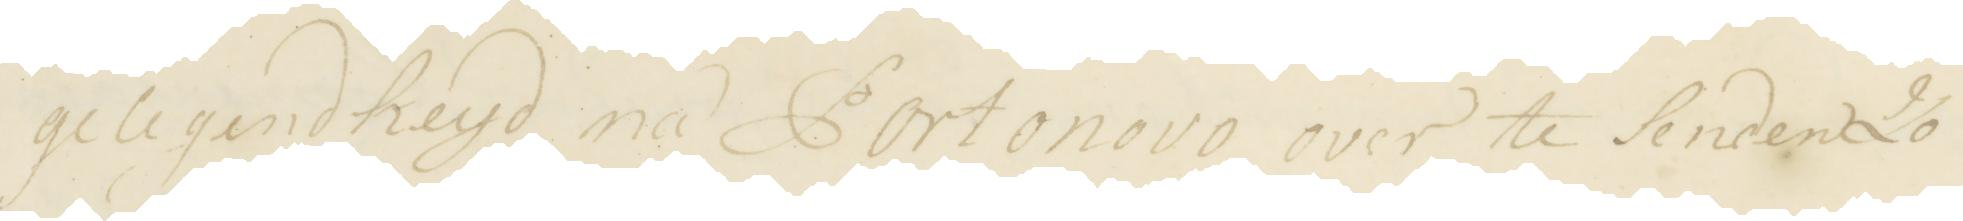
gelegendheyd na Portonovo over te senden zo
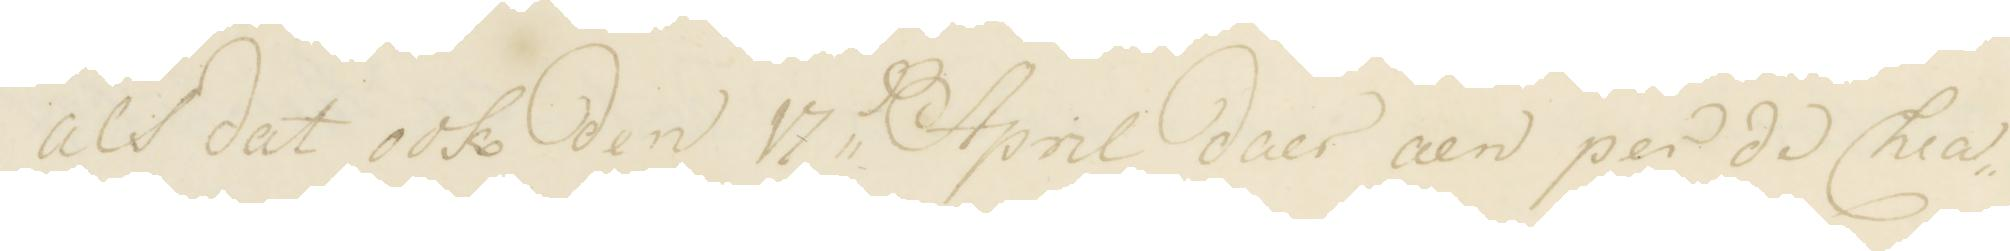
als dat ook den 17„e April daer aen per de Chia„
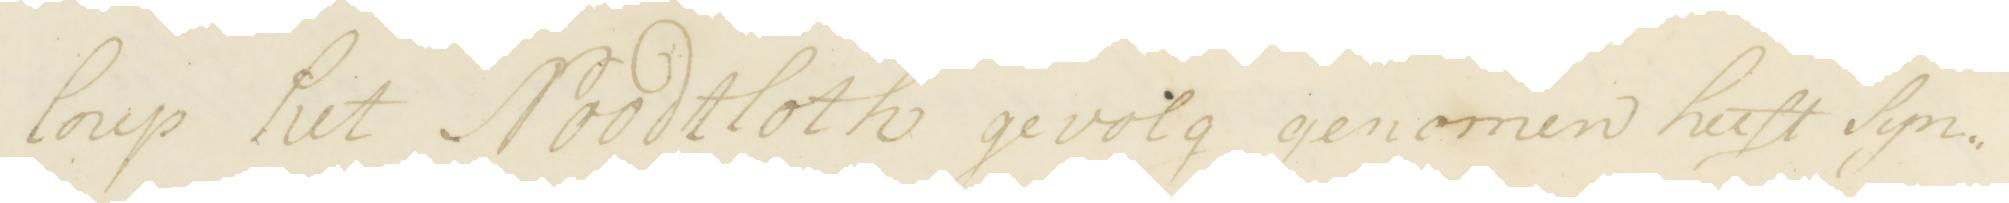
loup het Noodtloth gevolg genomen heeft syn„
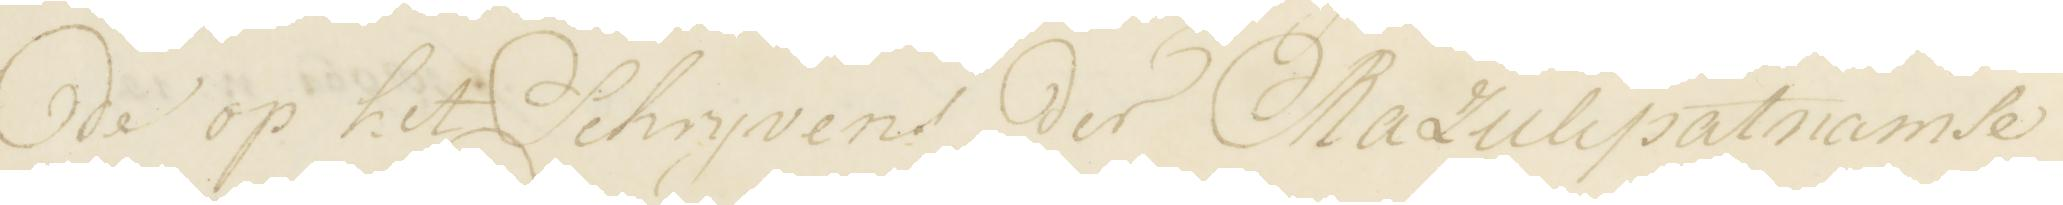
de op het schryvens der Mazulipatnamse
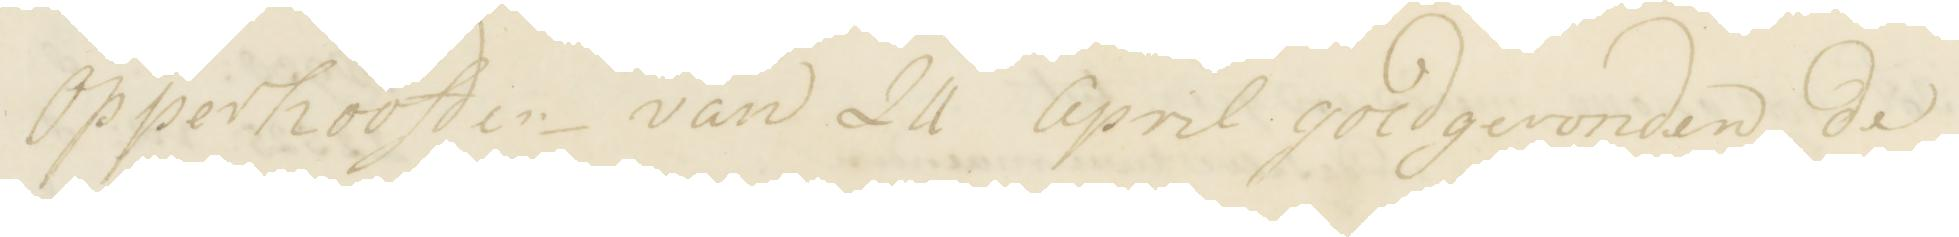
Opperhoofden van 24 april goedgevonden de
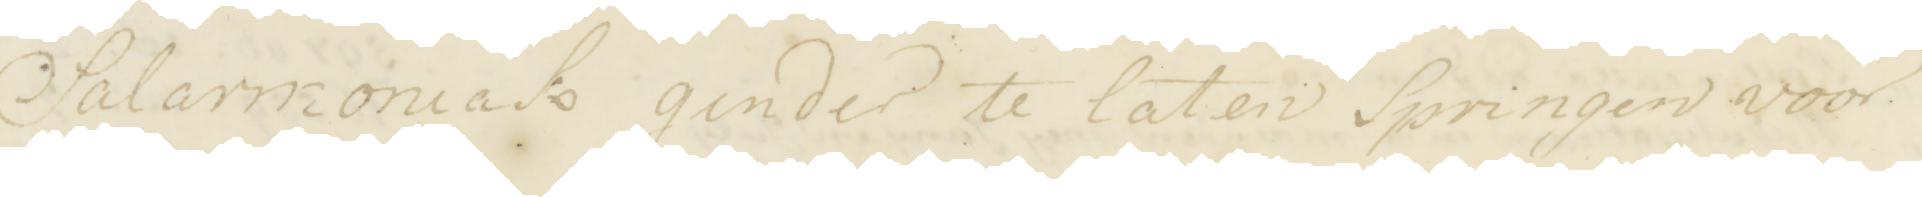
Salarmoniak ginder te laten springen voor
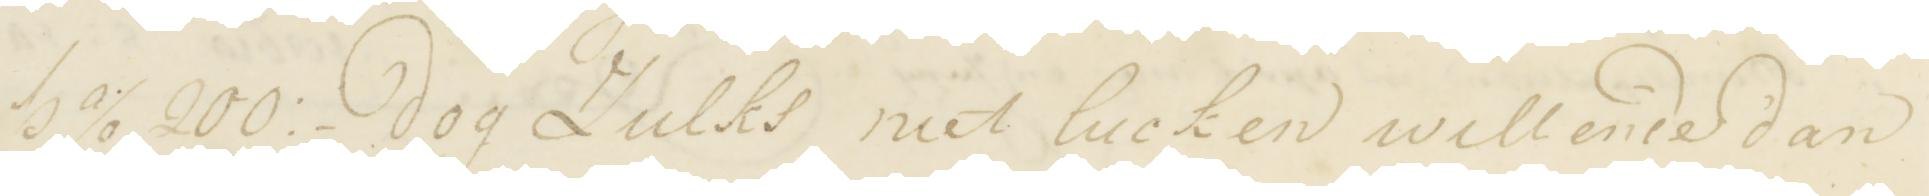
p a/o 200: dog zulks niet lucken willende dan
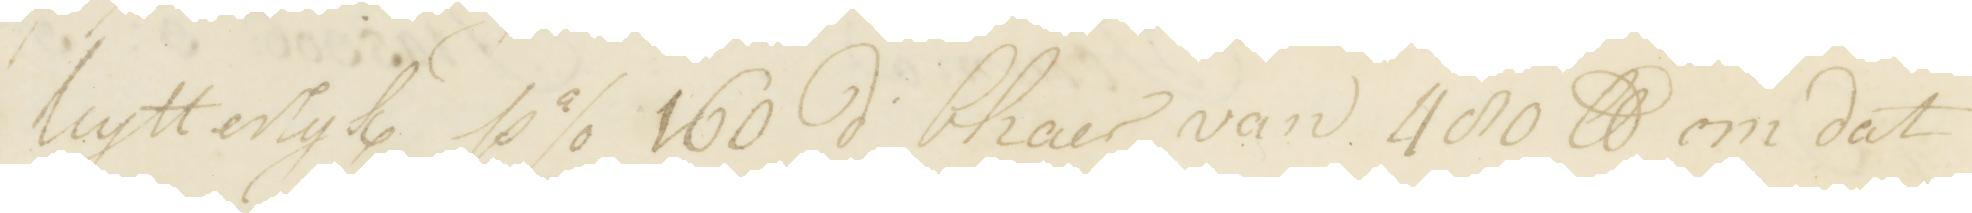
uytterlyk p a/o 160 d' bhaer van 480 lb om dat
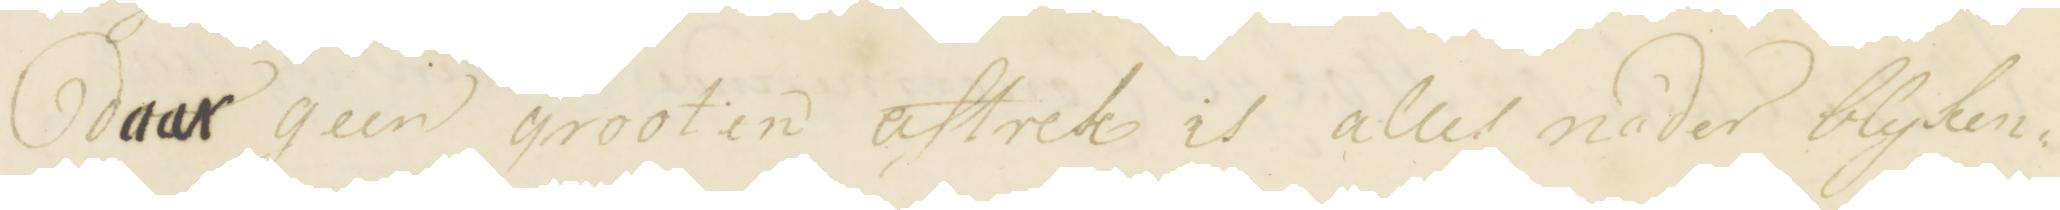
daar geen grooten aftrek is alles nader blyken„
